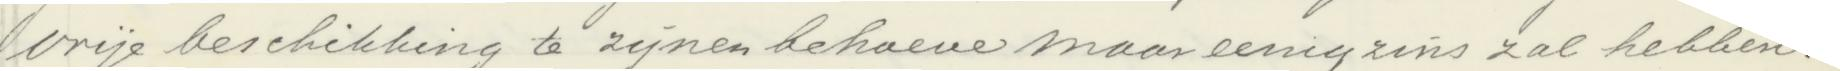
vrije beschikking te zijnen behoeve maar eenigzins zal hebben.
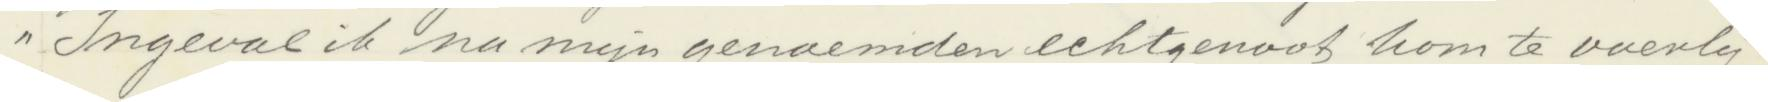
„ Ingeval ik na mijn genoemden echtgenoot kom te overlij
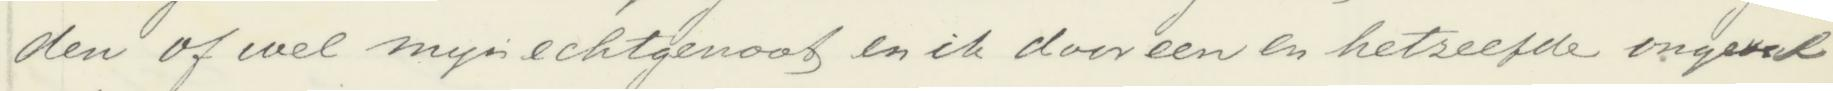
den of wel myn echtgenoot en ik door een en hetzelfde ongeval
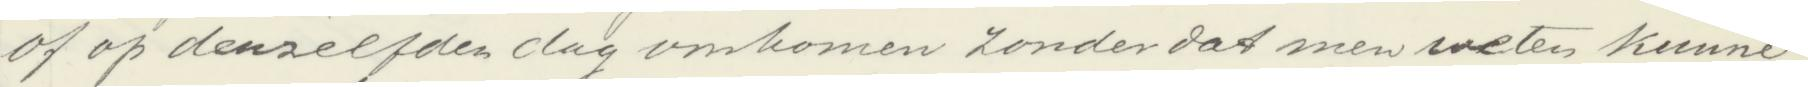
of op denzelfden dag omkomen zonder dat men weten kunne
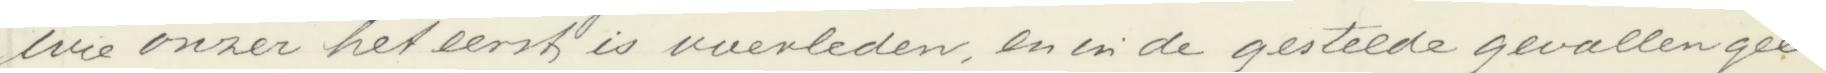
wie onzer het eerst is overleden, en in de gestelde gevallen gee-
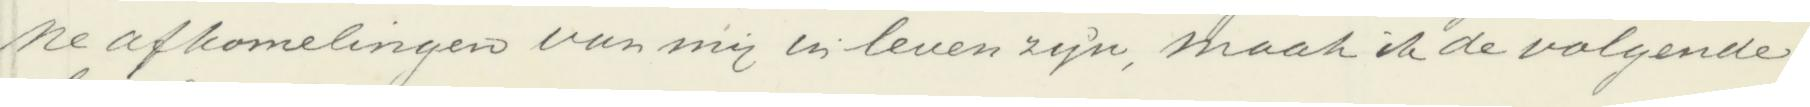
ne afkomelingen van mij in leven zijn, maak ik de volgende
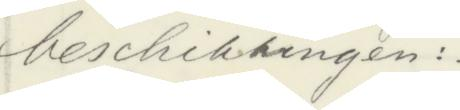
beschikkingen:
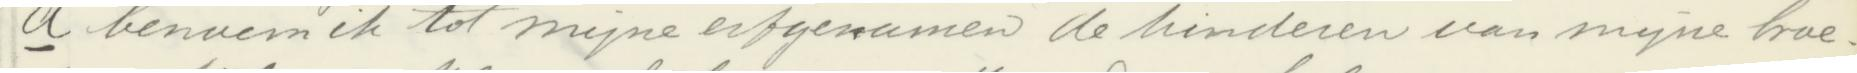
a benoem ik tot mijne erfgenamen de kinderen van myne broe
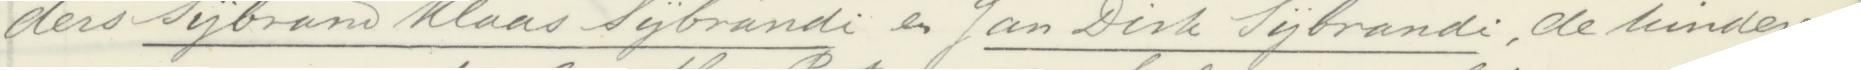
ders Sijbrand Klaas Sijbrandi en Jan Dirk Sijbrandi, de kinderen
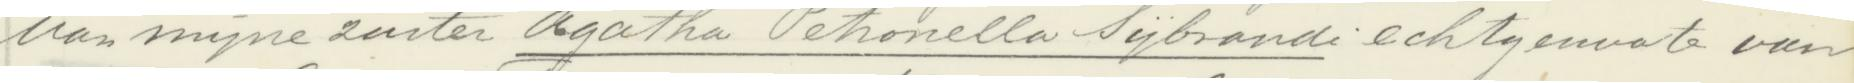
van mijne zuster Agatha Petronella Sijbrandi echtgenoote van
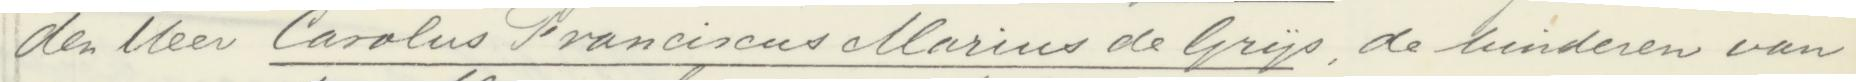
den Heer Carolus Franciscus Marius de Grijs, de kinderen van
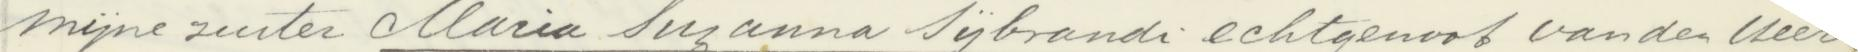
mijne zuster Maria Suzanna Sijbrandi, echtgenoot van den Heer
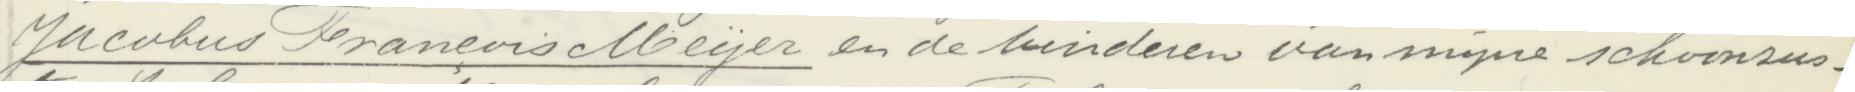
Jacobus François Meijer en de kinderen van mijne schoonzus-
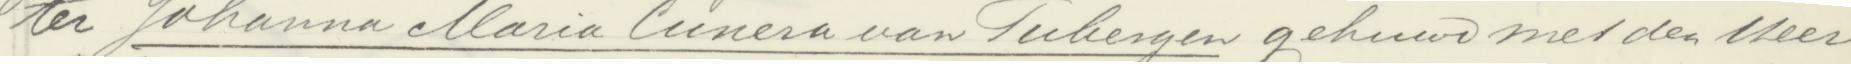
ter Johanna Maria Cunera van Tubergen gehuwd met den Heer
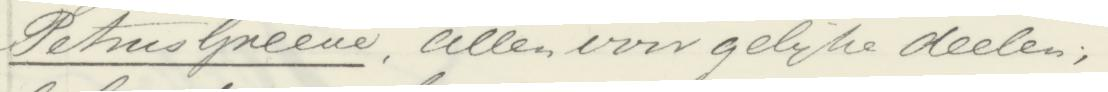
Petrus Greeve, allen voor geljke deelen;
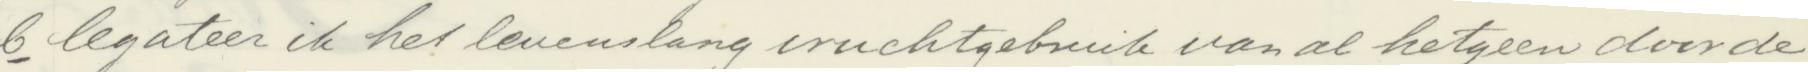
b legateer ik het levenslang vruchtgebruik van al hetgeen door de
